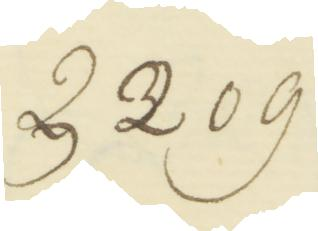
3209
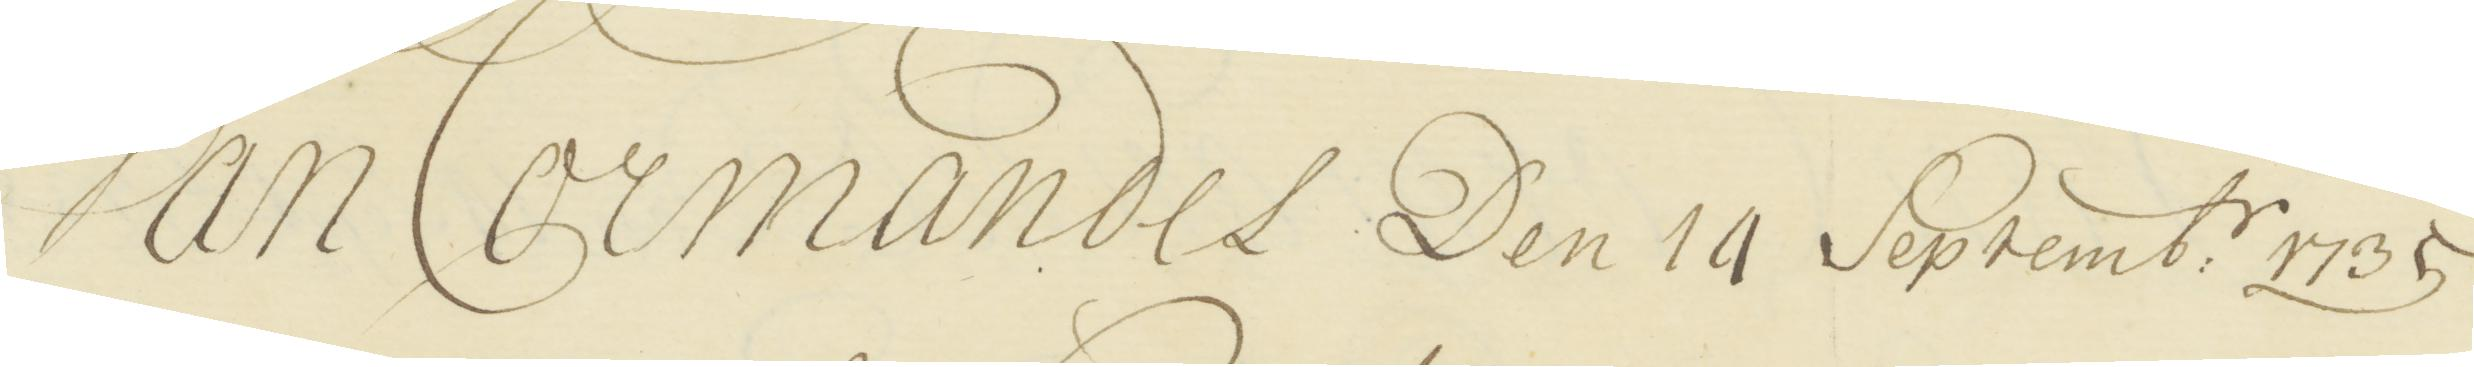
Van Cormandel Den 14 Septemb:r 1735
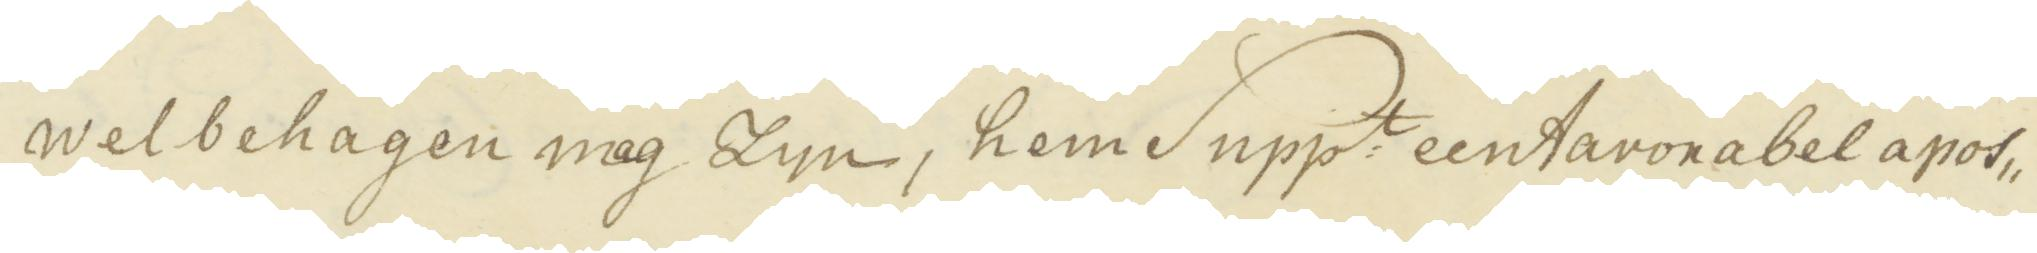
wel behagen mag zyn, hem Supp:t een favorabel apos„
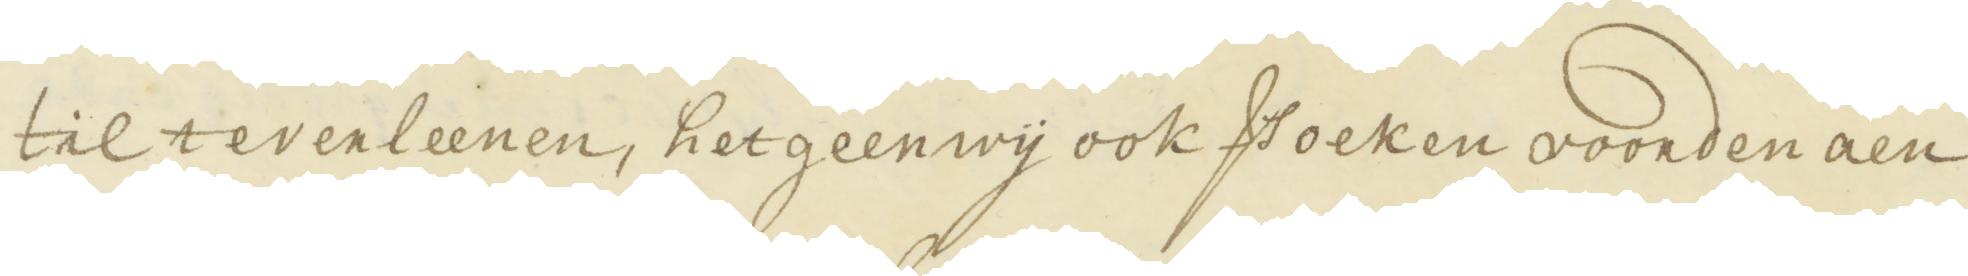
til teverleenen, het geen wij ook versoeken voor den aen
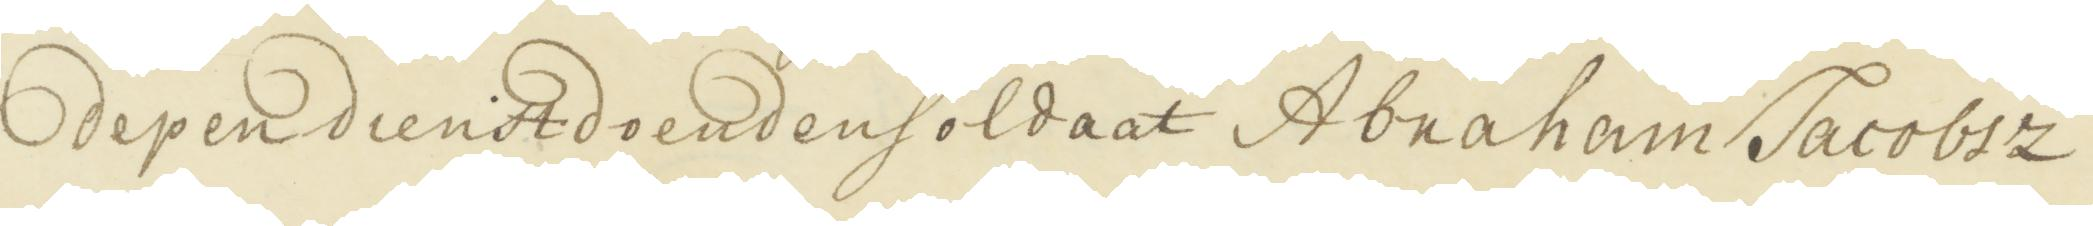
de pendienst doenden soldaat Abraham Iacobsz
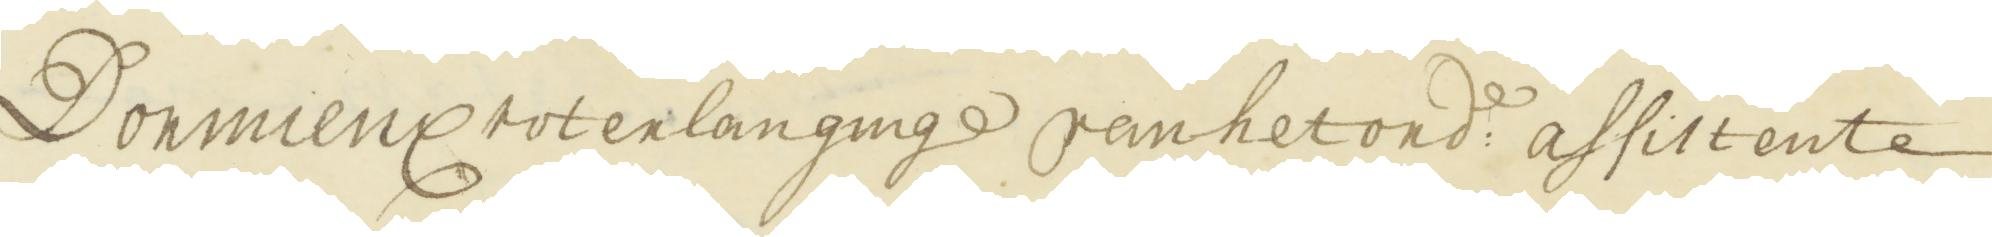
Dormieux tot erlanginge van het ord:e assistente
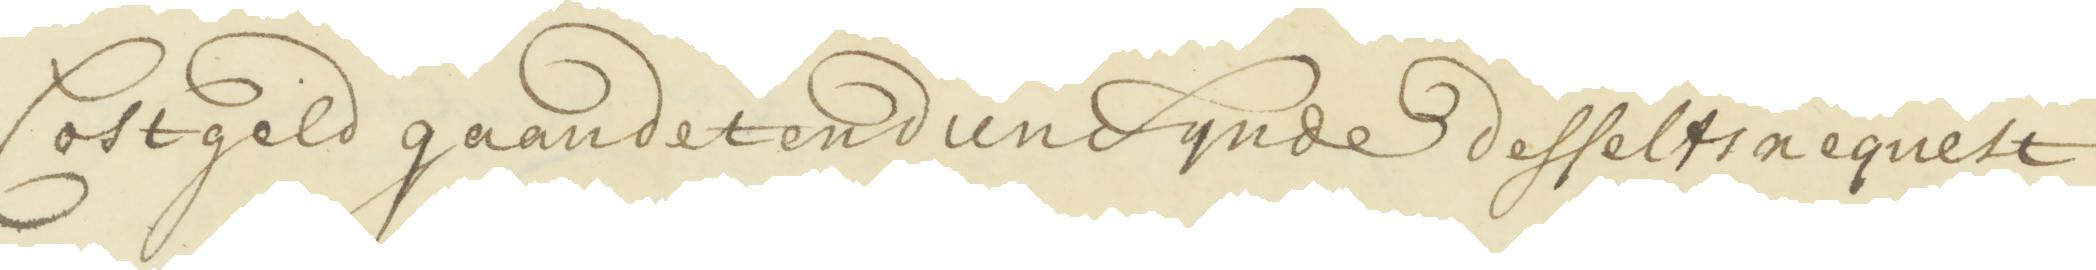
Costgeld gaande ten dien Synde desselfs request
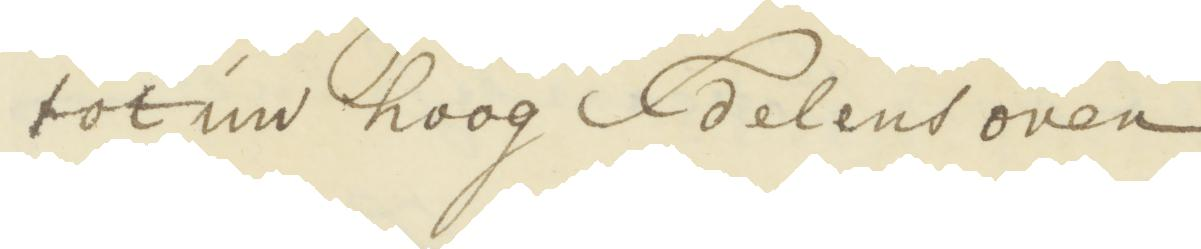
tot uw hoog Edelens over
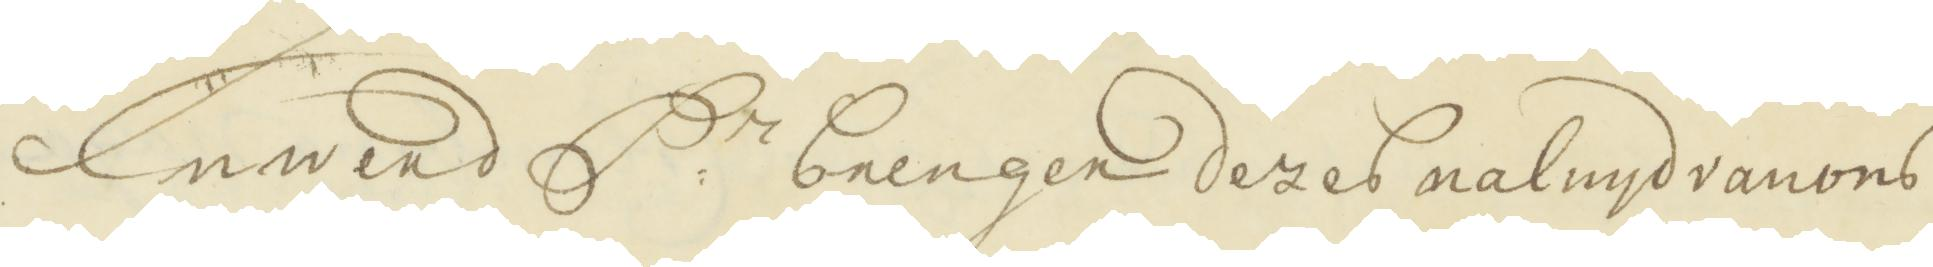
En werd P:r brenger dezes naluyd van ons
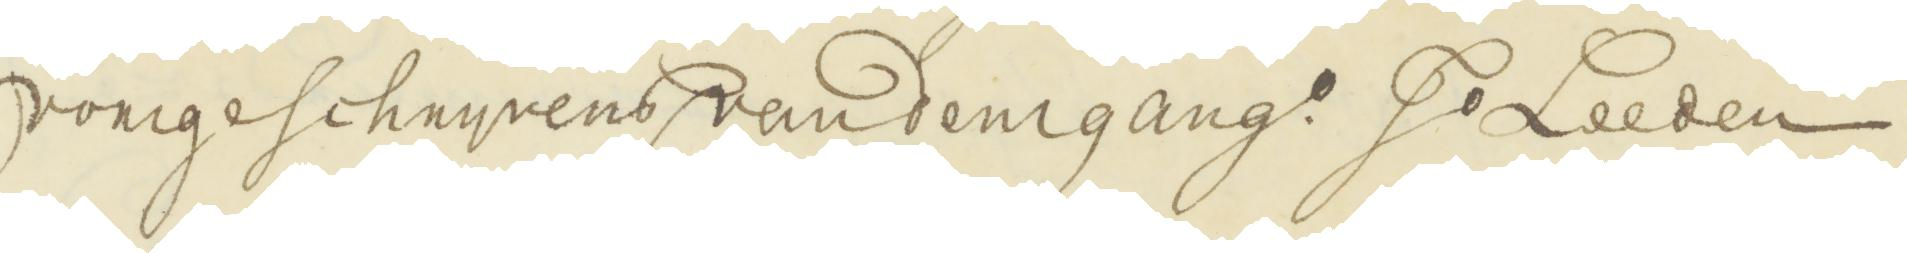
vorige schryvens van den 19 aug:o J:o Leeden
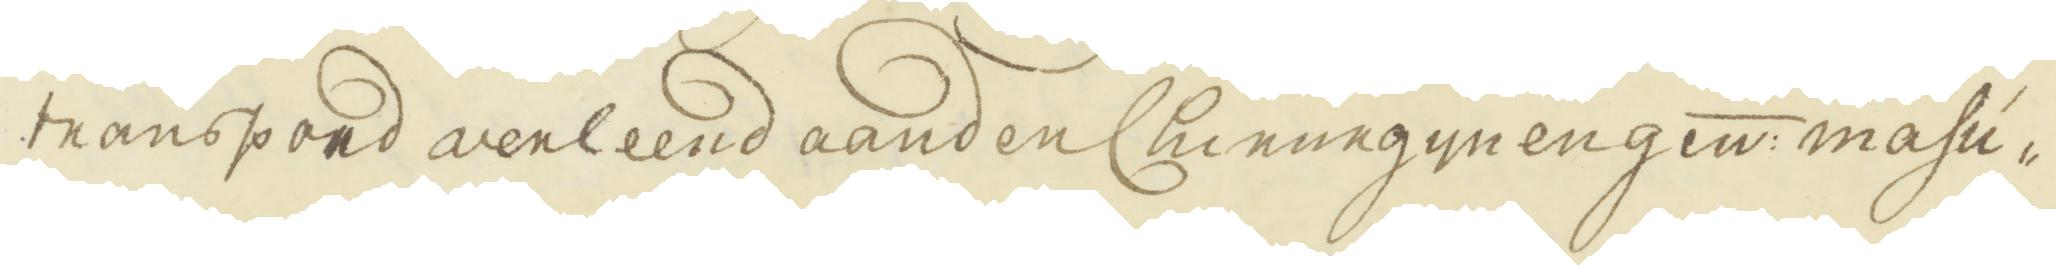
transpord verleend aan den Chirurgyn en gew: masu„
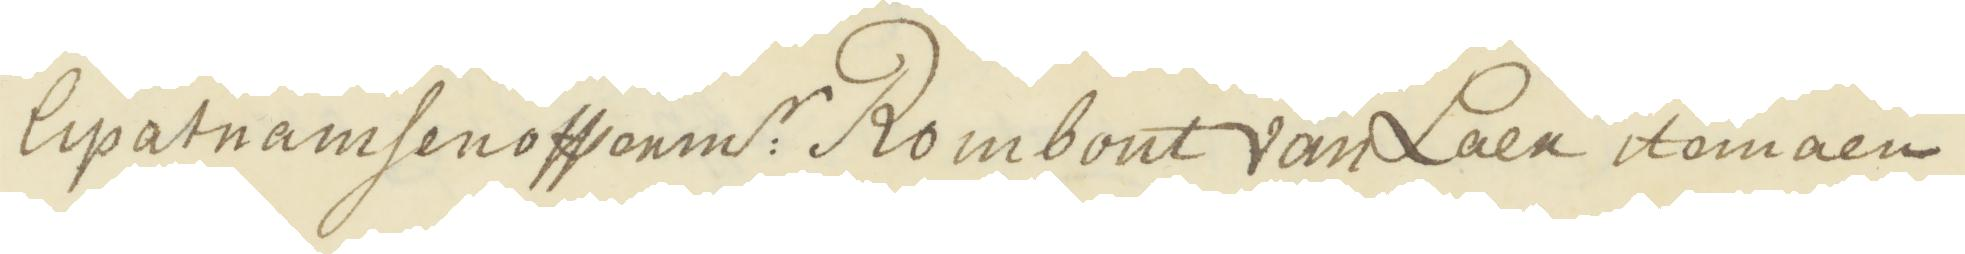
lipatnamsen opperm:r Rombout van Laer item aen
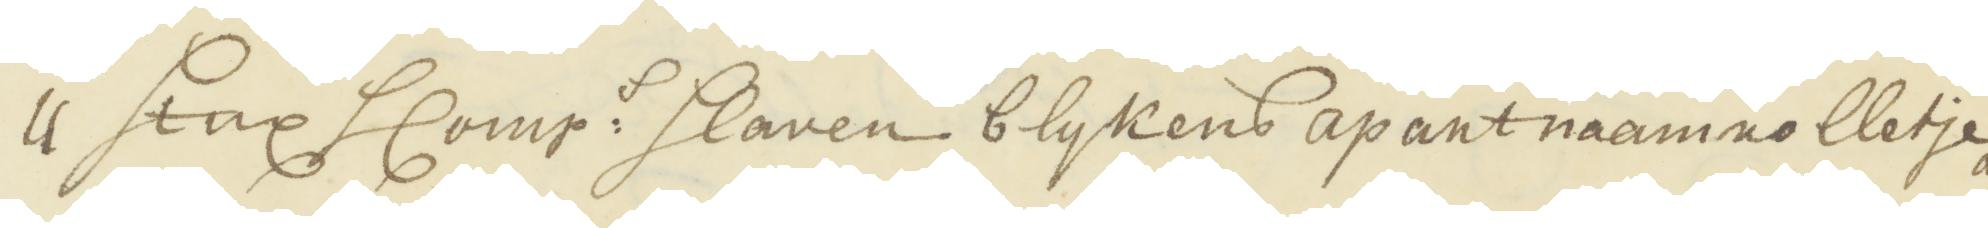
4 Stux SComp:s Slaven blykens apart naamrolletje
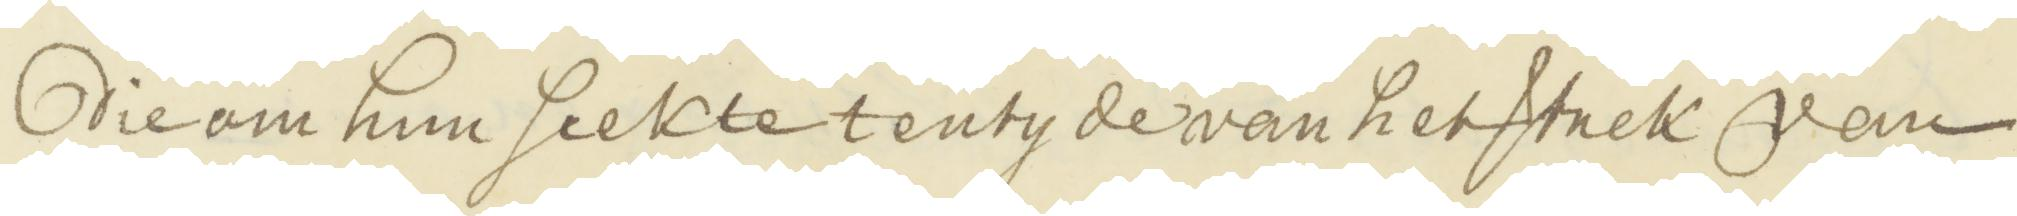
die om hun Siekte ten tyde van het vertrek van
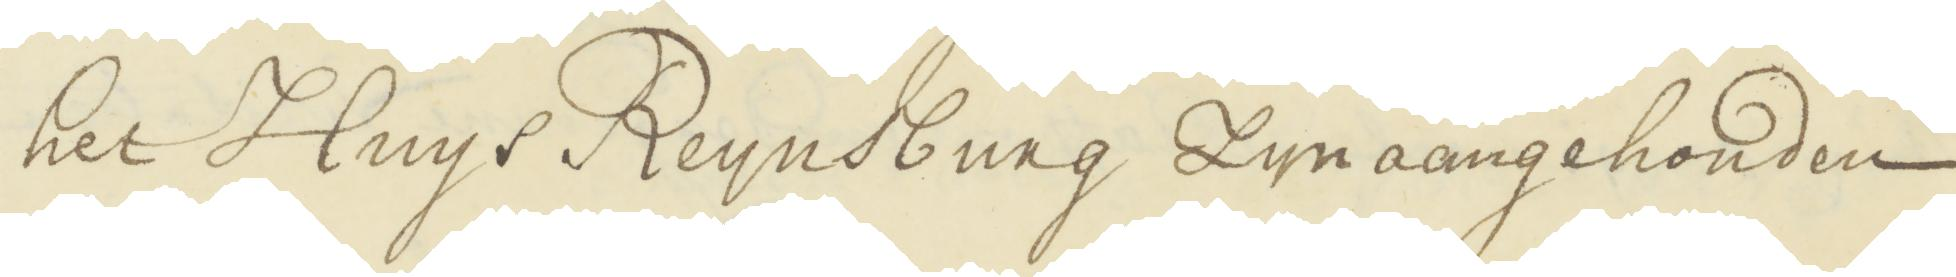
het Huys Reynsburg Zyn aangehouden
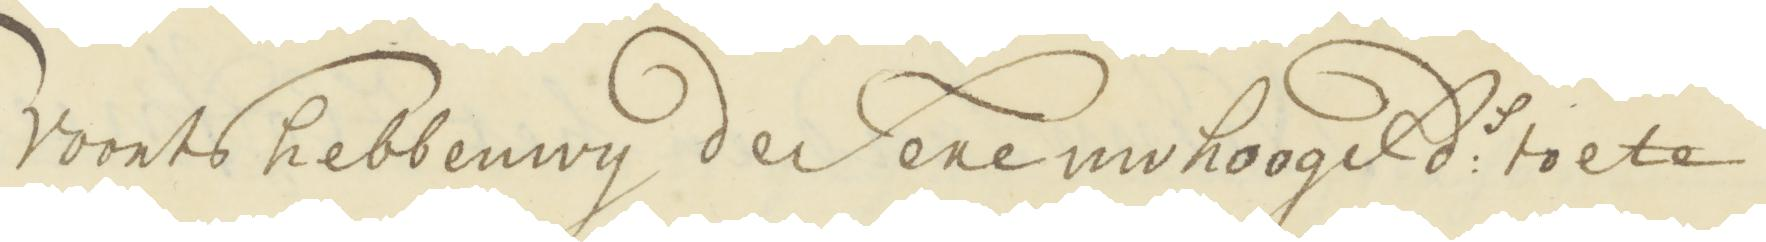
Voorts hebben wy de Eere uw hoog Ed:s toe te
